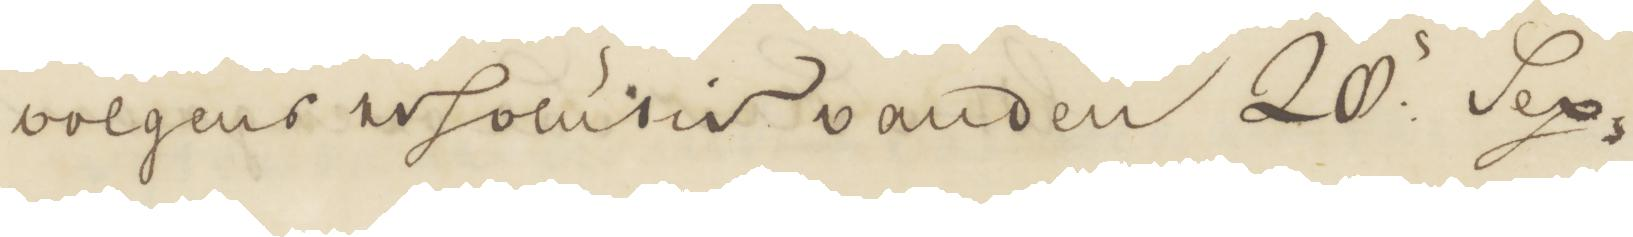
volgens resolutie van den 28:en Sep,
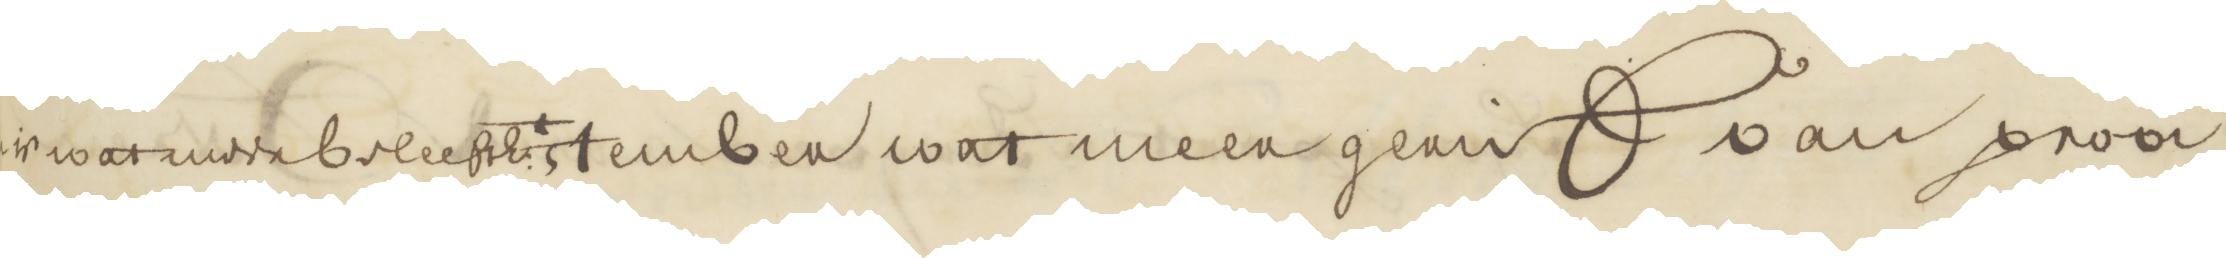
is wat meer beleefth:t tember wat meer gerief van provi
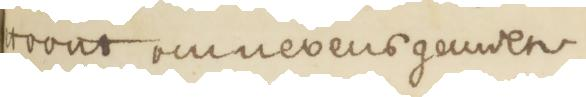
toont omnevens gemene
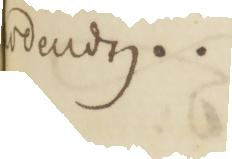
edenen.
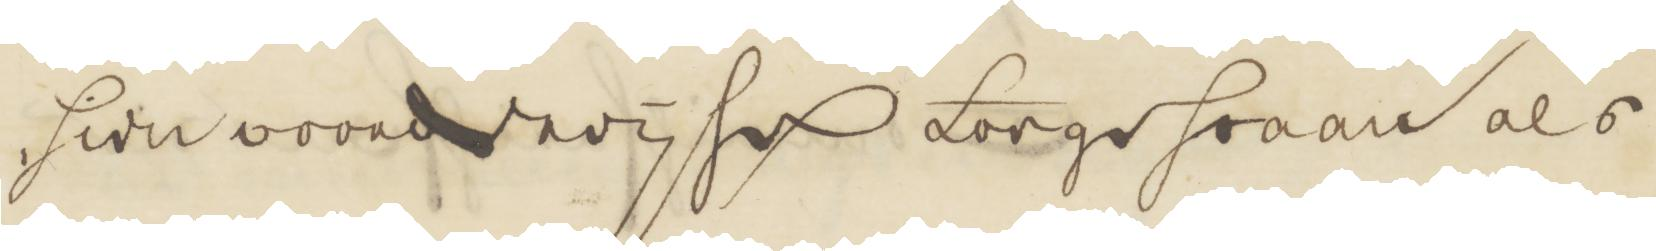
sien voordereijse toegestaan als
